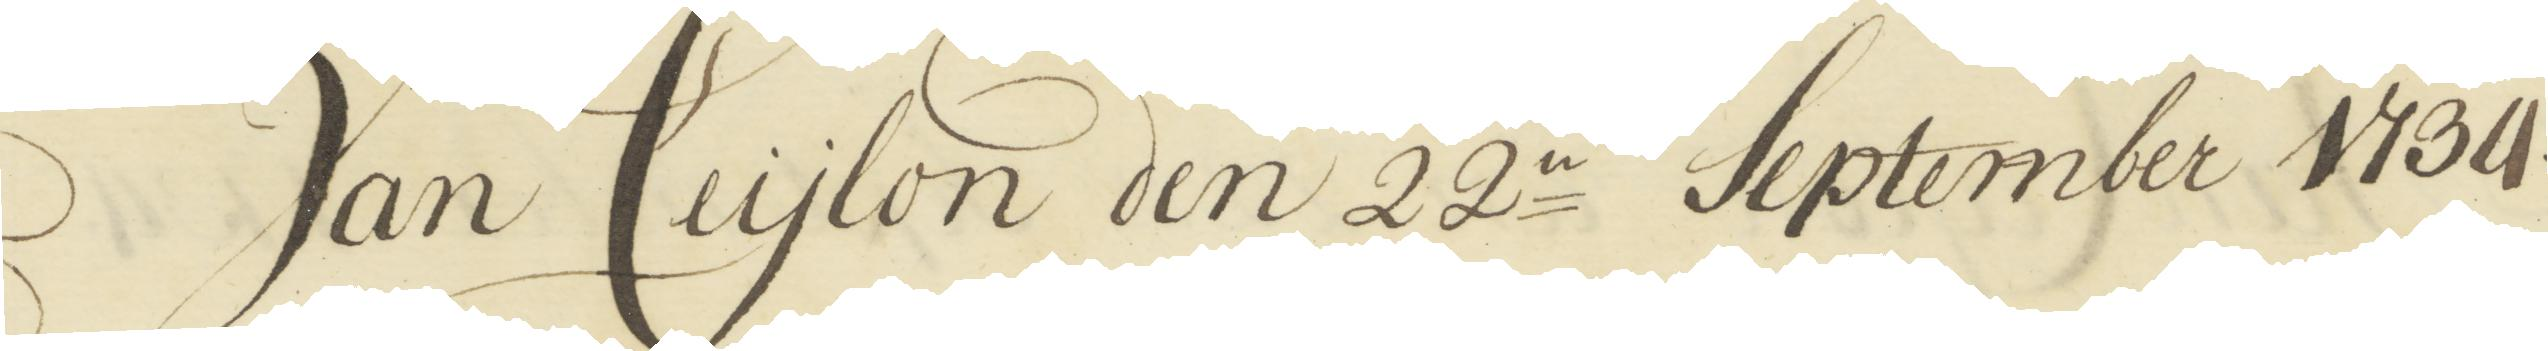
Van Ceijlon den 22=en September 1734.
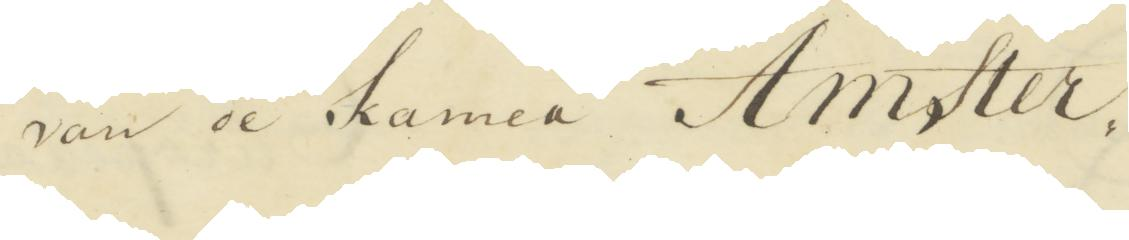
van de kamer Amster„
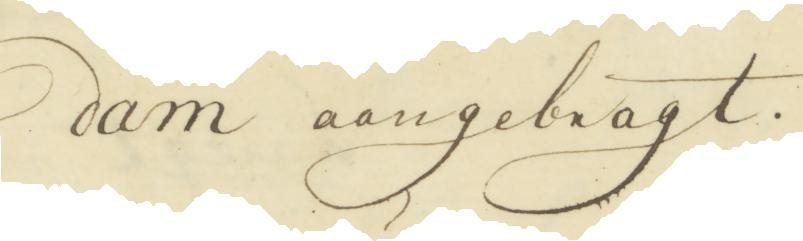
dam aangebragt.
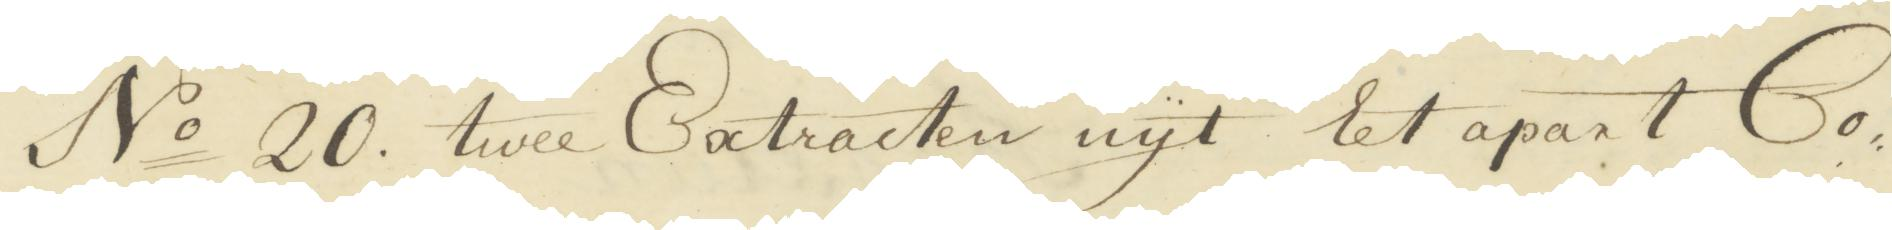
N=o 20. twee Extracten uijt het apart Co„
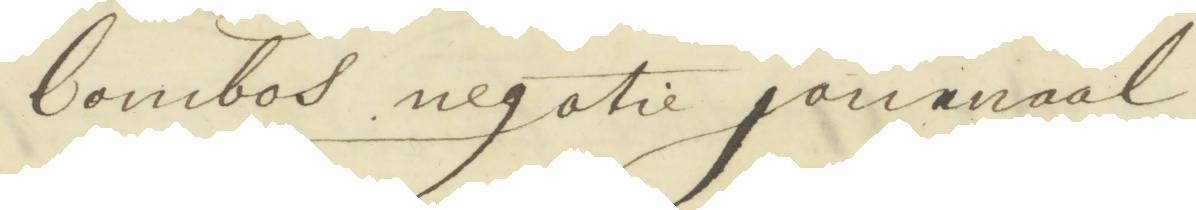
lombos negotie journaal
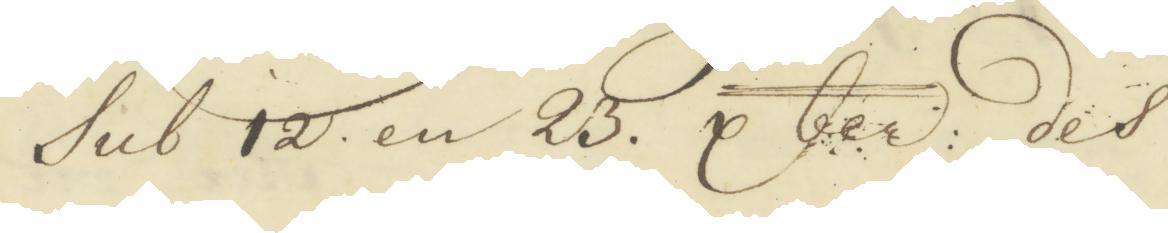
sub 12. en 23. xber: des
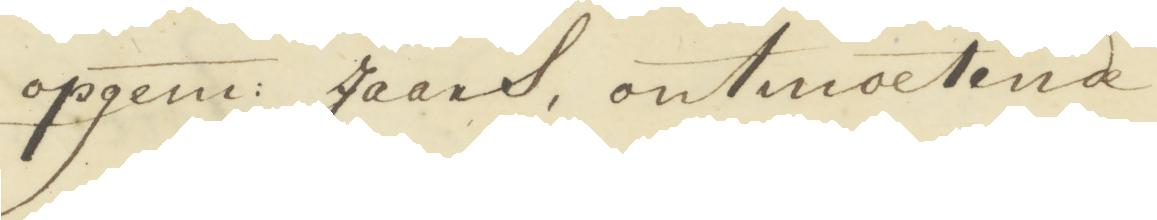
opgem: Jaars, ontmoetende
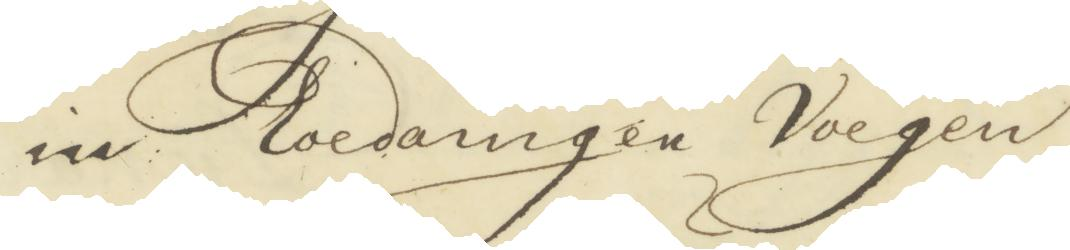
in hoedanigen Voegen
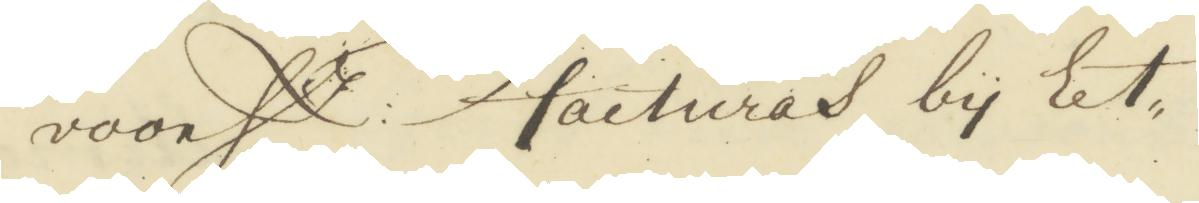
voorsz: facturas bij het„
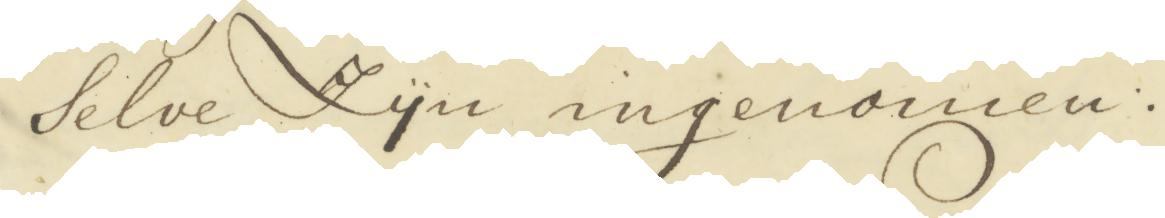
selve Zijn ingenomen.
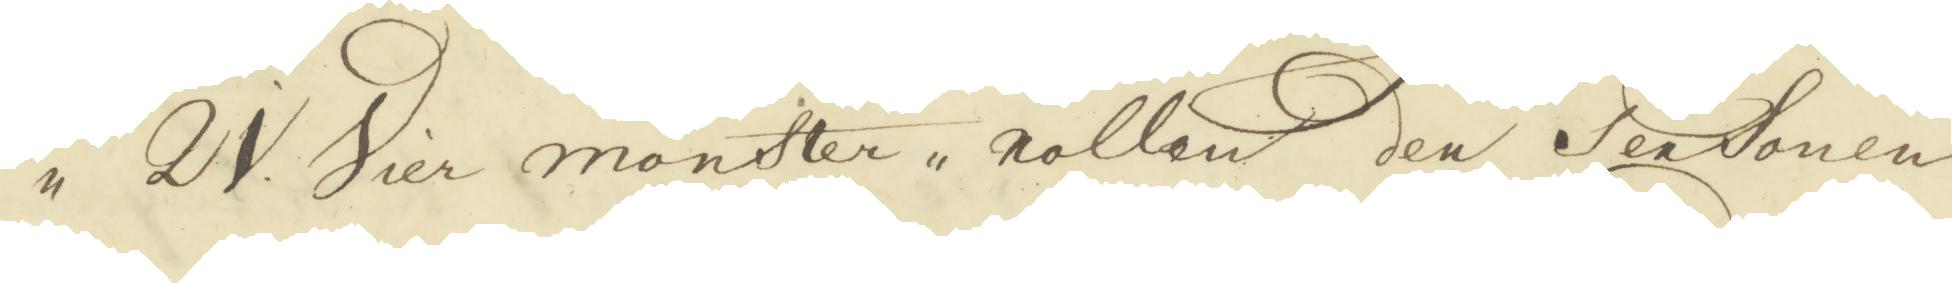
„ 21. Vier monster„ rollen der Personen
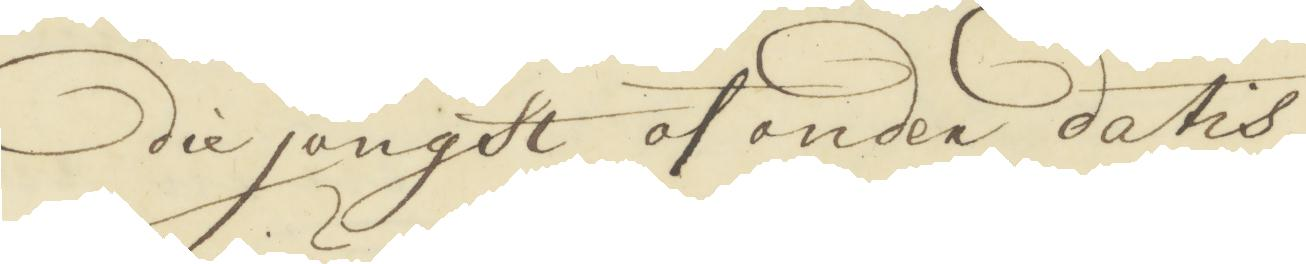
die jongst of onder datis
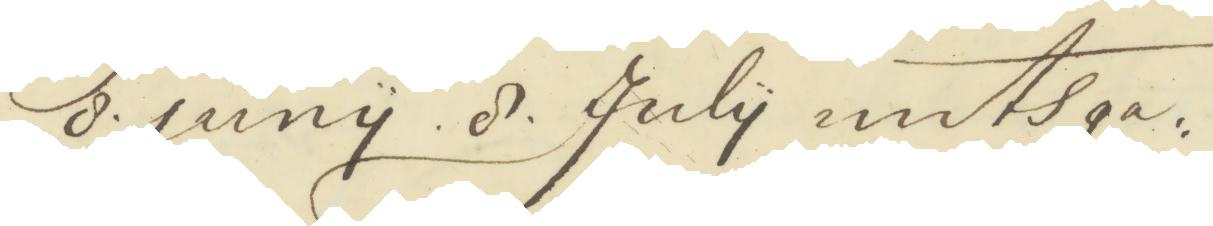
8. Junij. 8. Julij mitsga„
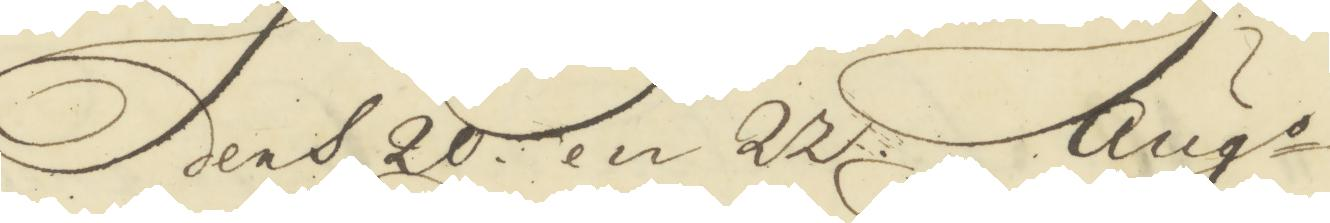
ders 20. en 22. Aug=o
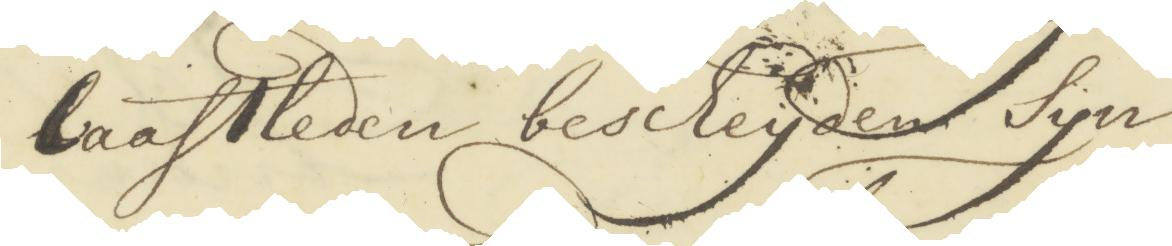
laastleden bescheijden Sijn
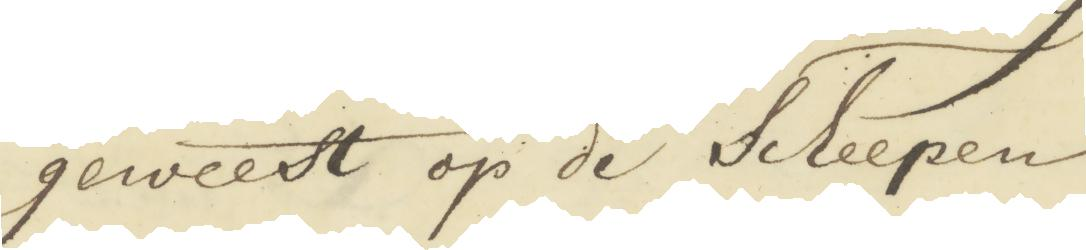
geweest op de Scheepen
